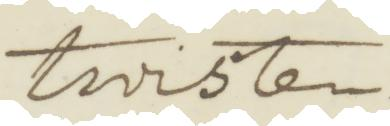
twisten
